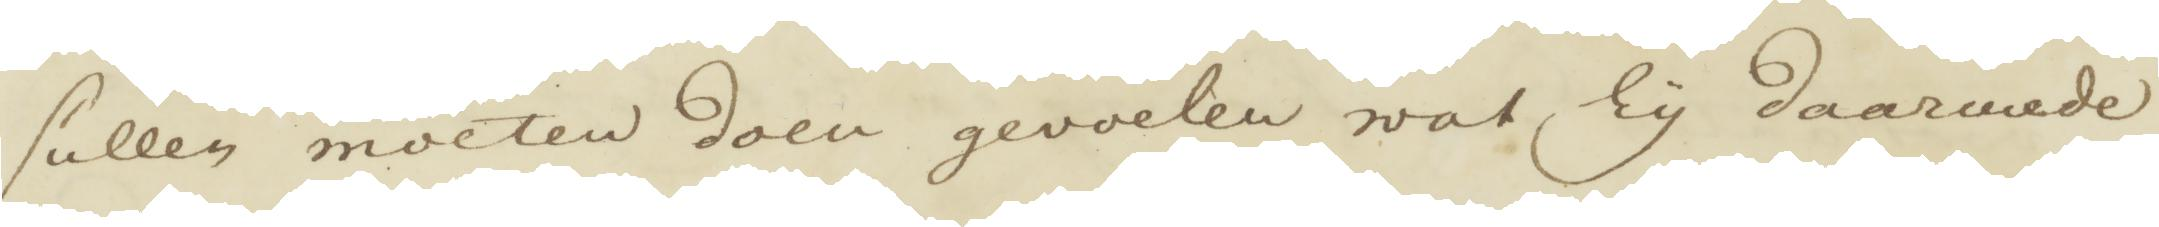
sullen moeten doen gevoelen wat hij daarmede
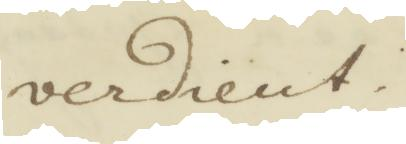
verdient.
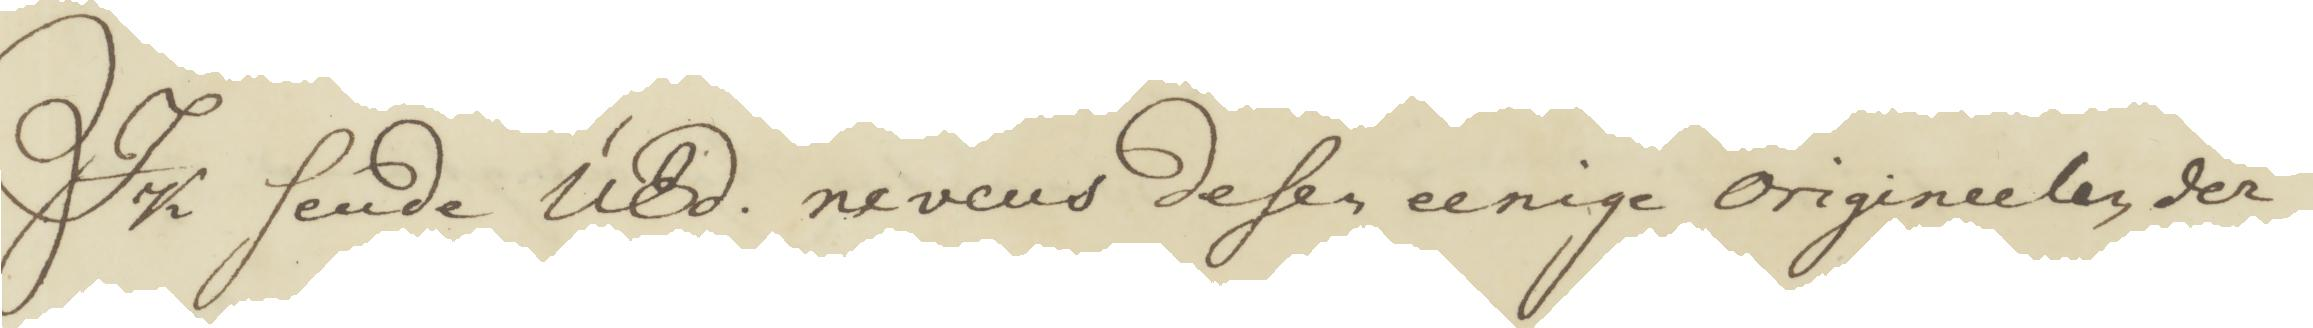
Ik sende UEd. nevens desen eenige Origineelen der
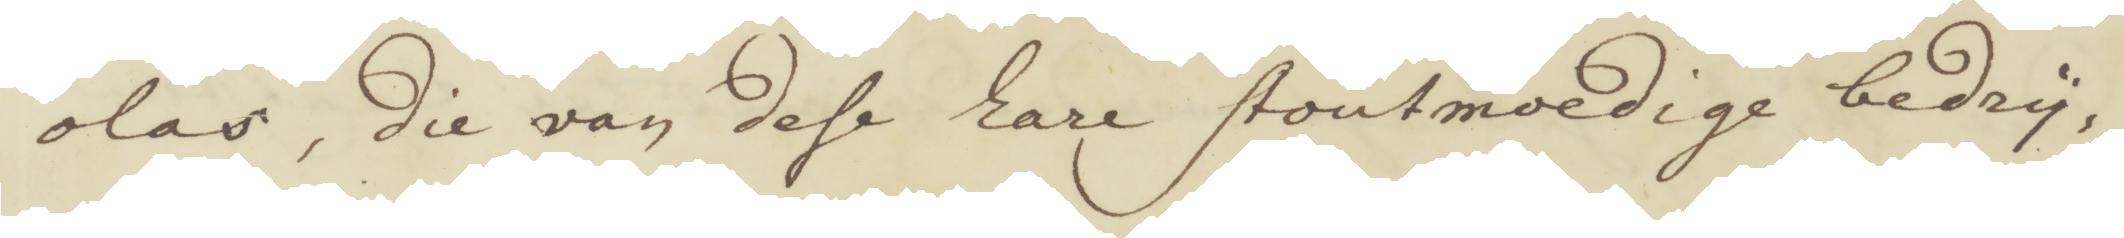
olas, die van dese hare stoutmoedige bedrij,
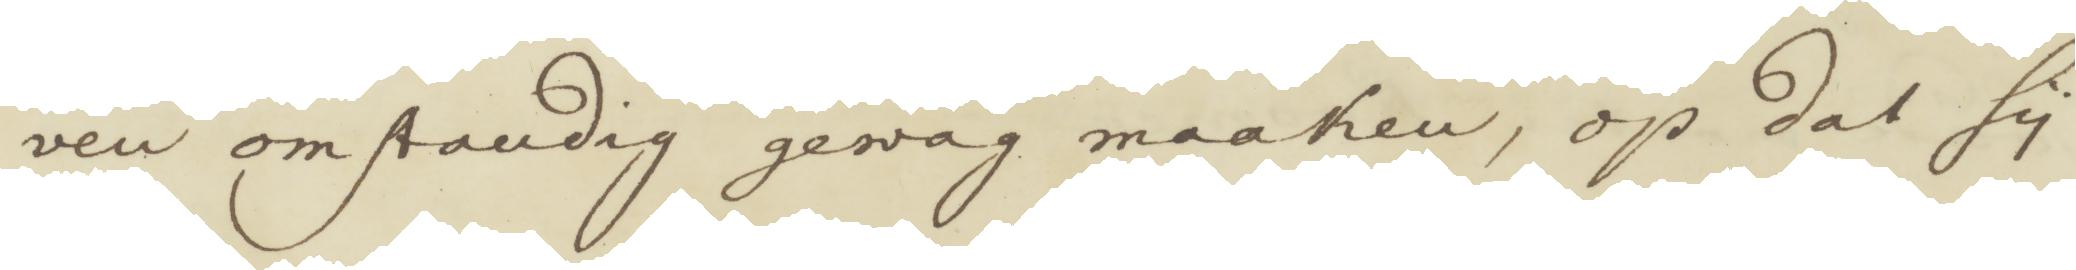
ven omstandig gewag maaken, op dat sij
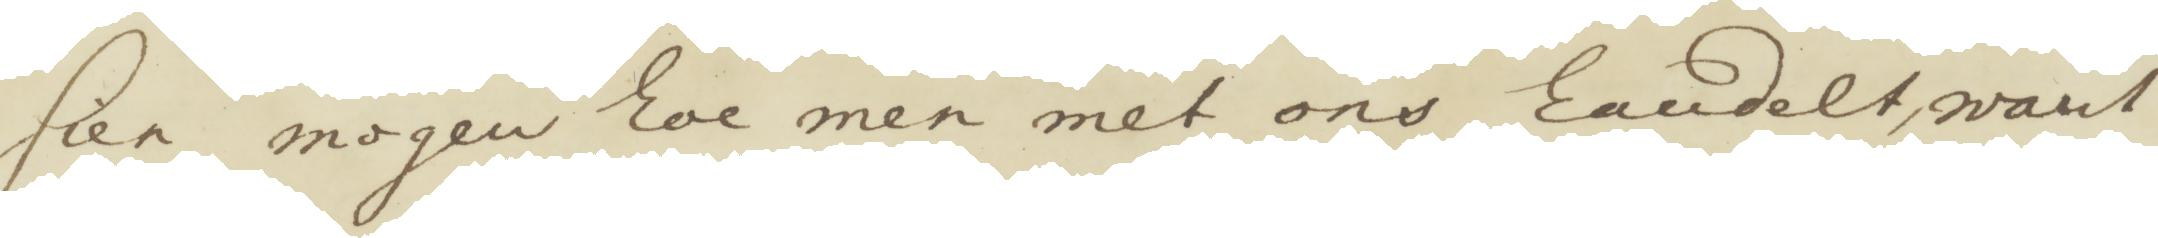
sien mogen hoe men met ons handelt, want
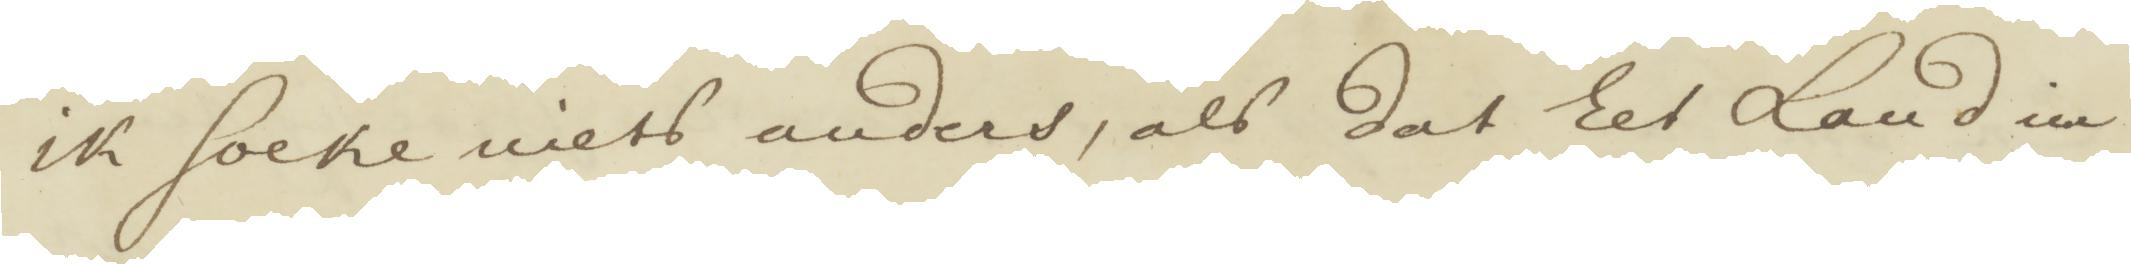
ik soeke niets anders, als dat het Land in
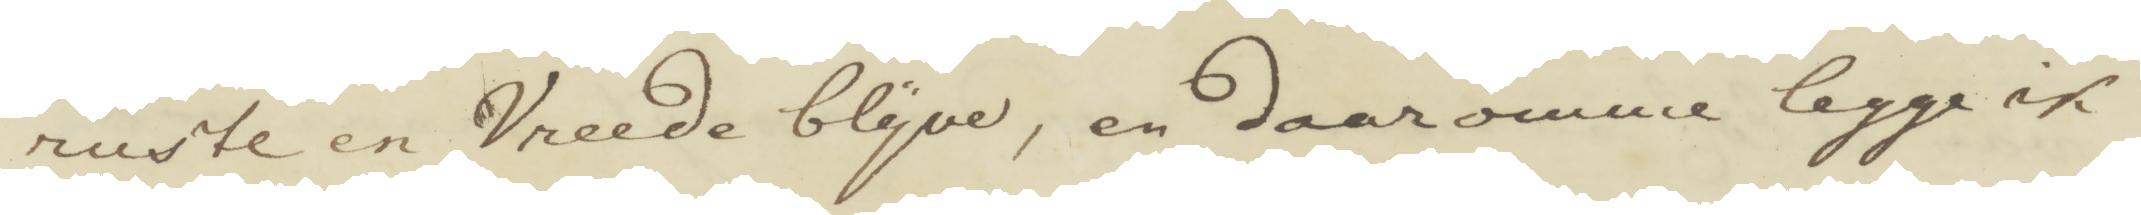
ruste en Vreede blijve, en daaromme legge ik
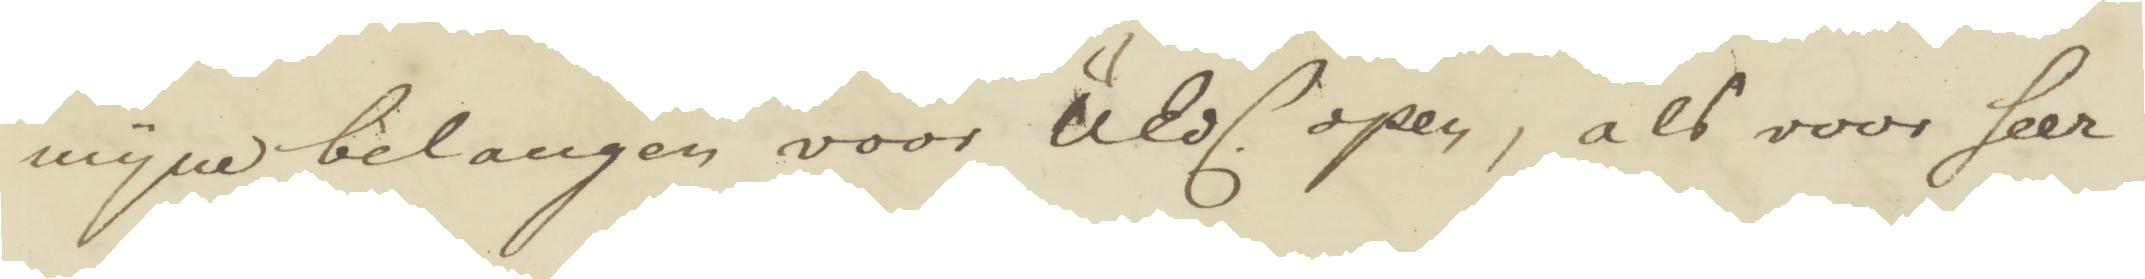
mijne belangen voor UEd. open, als voor seer
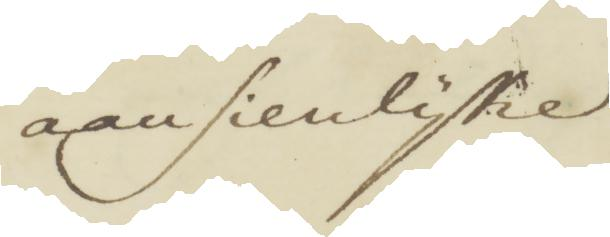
aansienlijke
